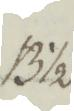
13½
